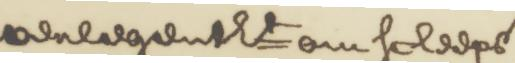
verlegenth=t om scheeps
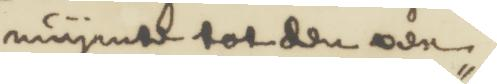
ruijmte tot den ver„
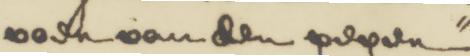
voer van den peper
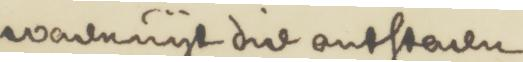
waeruijt die ontstaen
